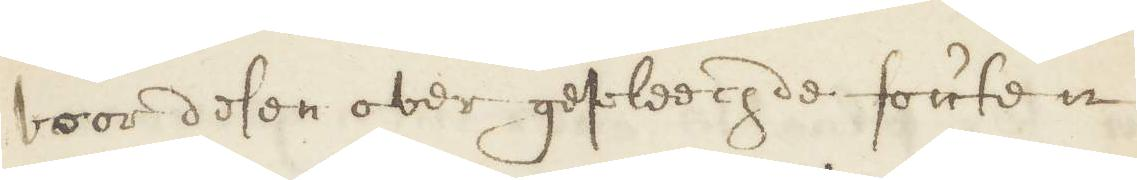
voor desen over gepleechde fouten
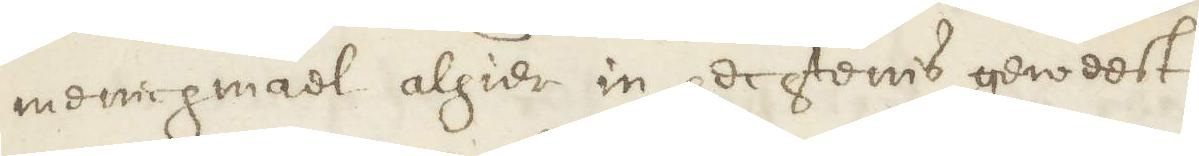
menigmael alhier in hechtenis geweest
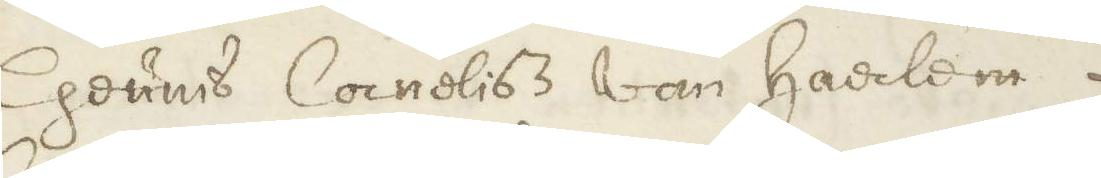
Theunis Cornelis van haerlem
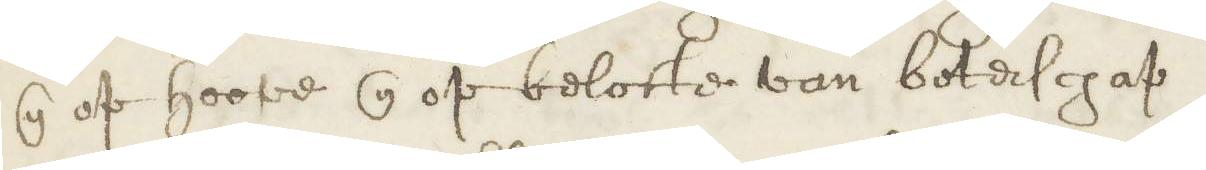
ende op hoope ende op belofte van beterschap
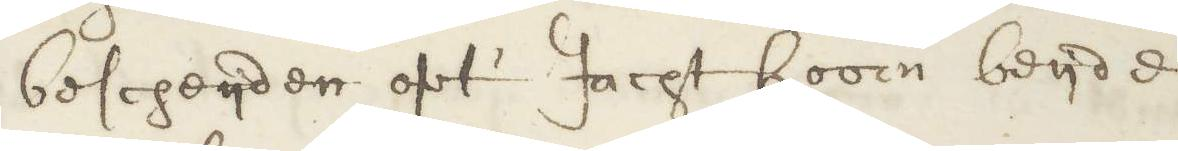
bescheijden opt' Jacht hoorn beijde
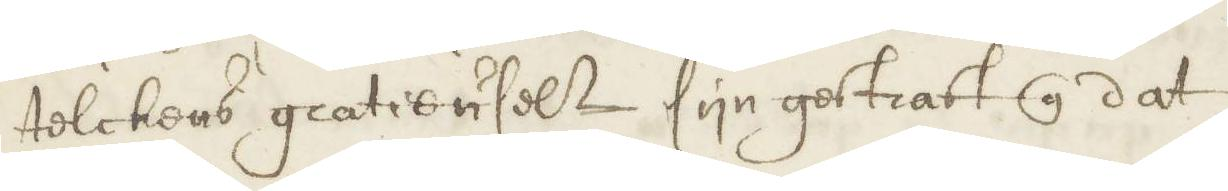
telckens gratieuselijk sijn gestraft ende dat
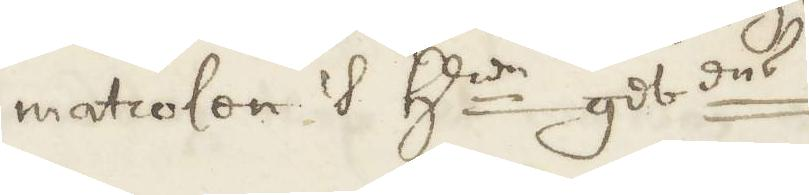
matroson 's h=ren gev=ens
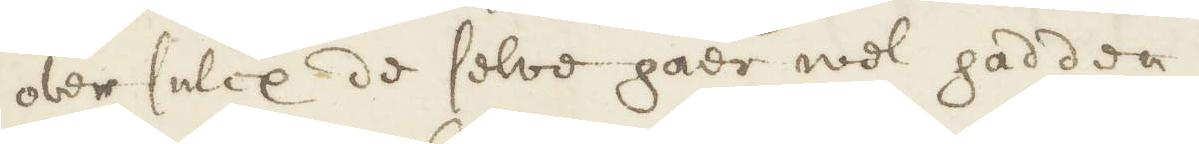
over sulcx de selve haer wel hadden
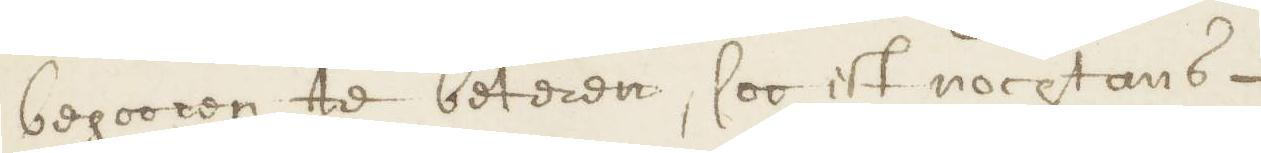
behooren te beteren, soo ist nochtans —
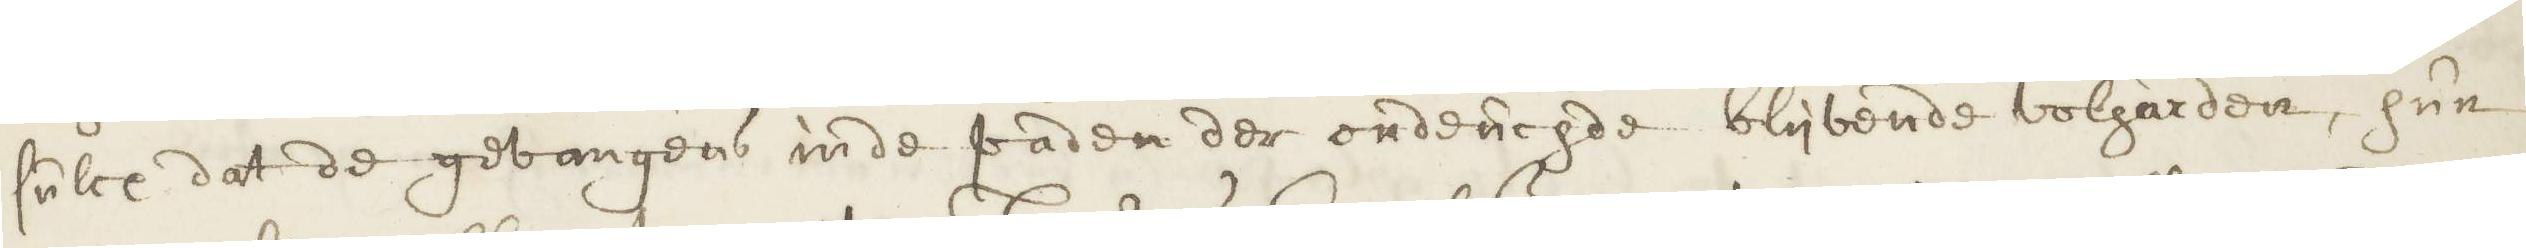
sulcx dat de gevangens in de paden der ordeuchde blijvende volharden, hun
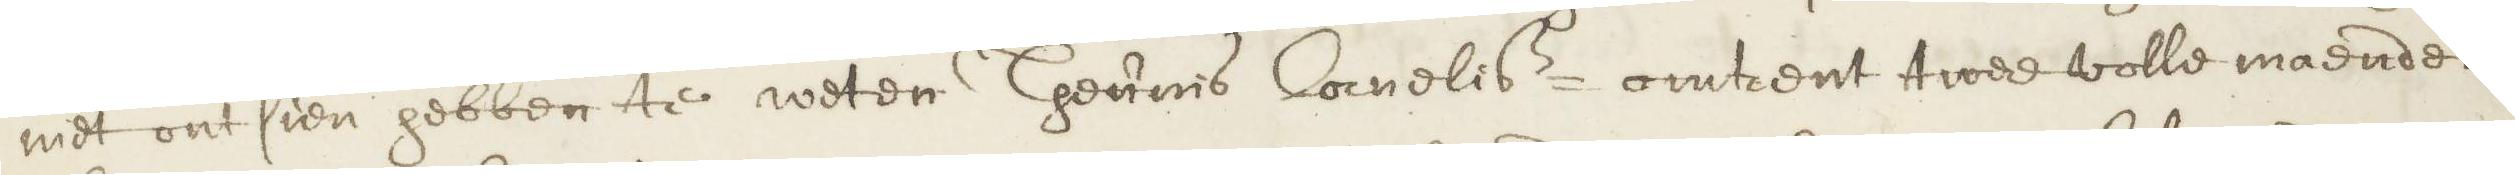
niet ontsien hebben te weten Theunis Cornelis = omtent twee volle maenden
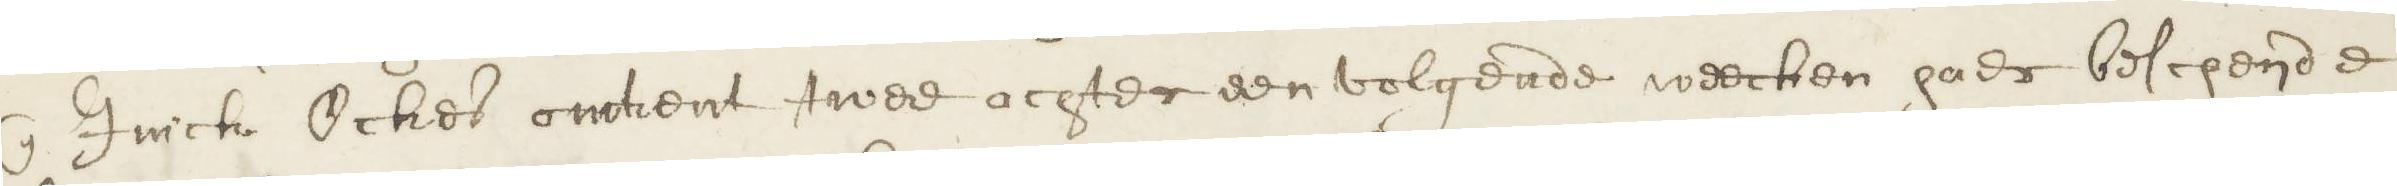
ende Jnick Ockes omkent twee achter een volgende weecken haer bescheyde
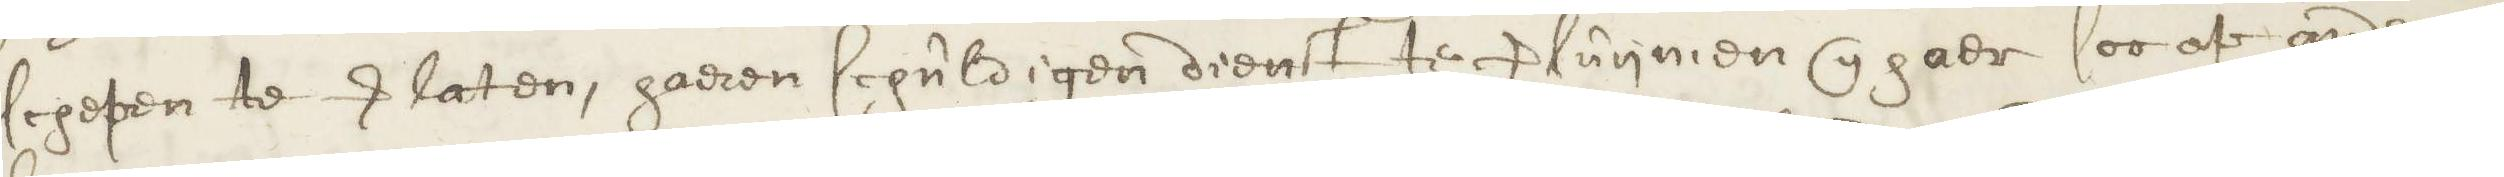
schepen te verlaten, haeren schuldigen dienst te versuijmen ende haer soo op andere
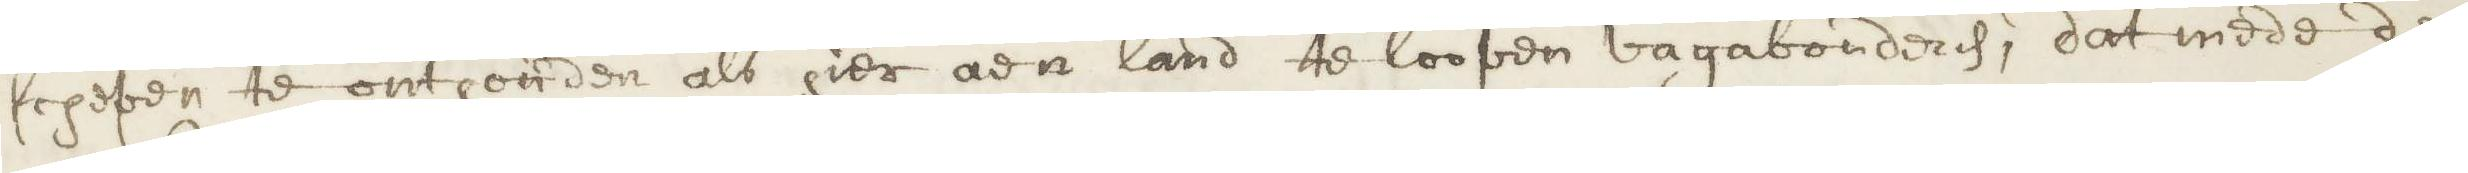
schepen te onthouden als hier aen land te loopen vagabonderen, dat mede de
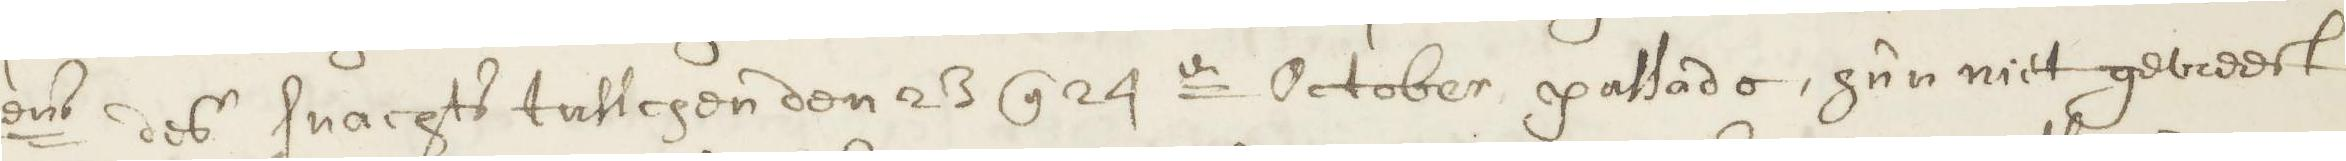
gev=ens des snachts tusschen den 23 ende 24=e October passado, hun niet gevreest
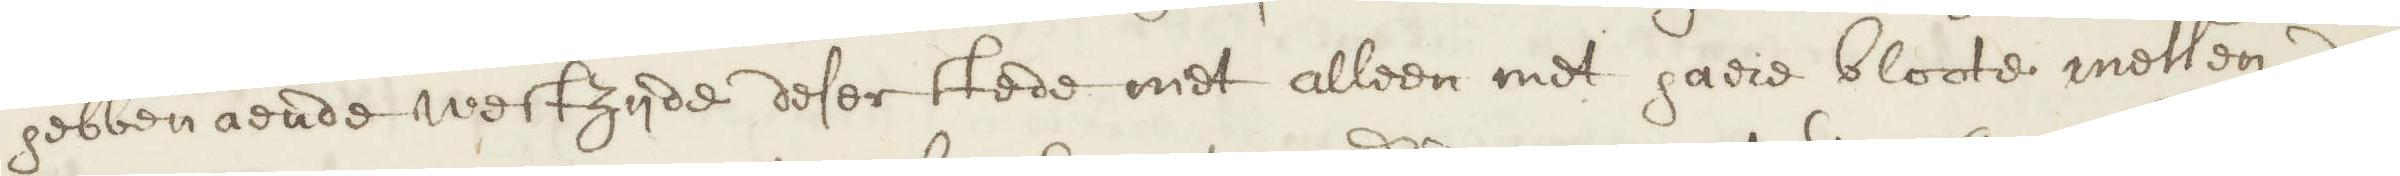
hebben aende westzijde deser stede met alleen met haere bloote messen de
